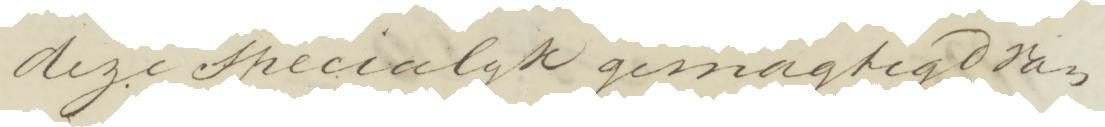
deze specialyk gemagtigd van
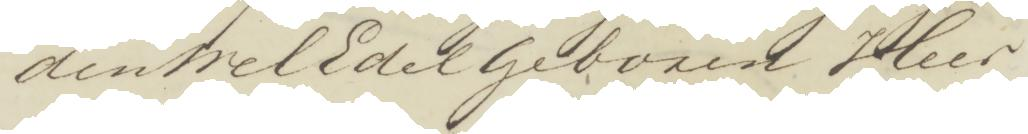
den wel Edel Geboren Heer
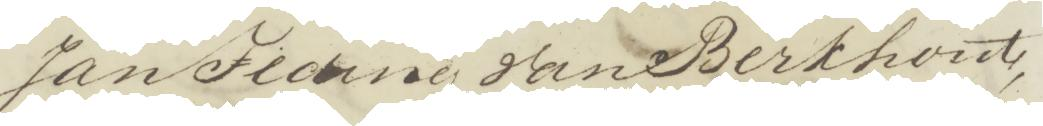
Jan Teding van Berkhout,
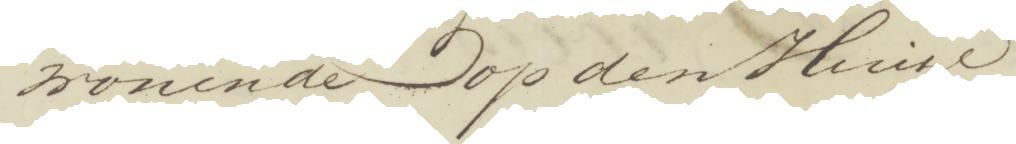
wonende op den Huize
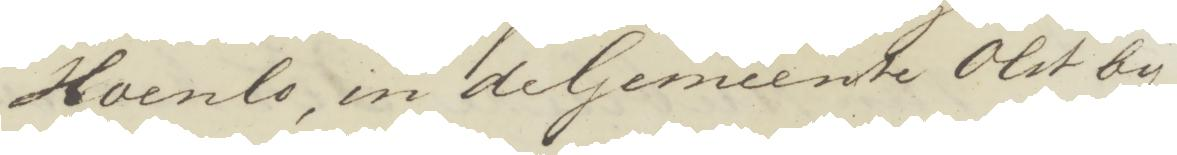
Hoenlo, in de Gemeente Olst by Deven=
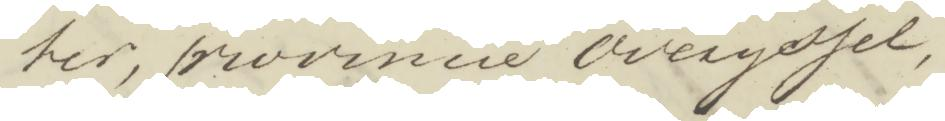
=ter, provincie Overyssel,
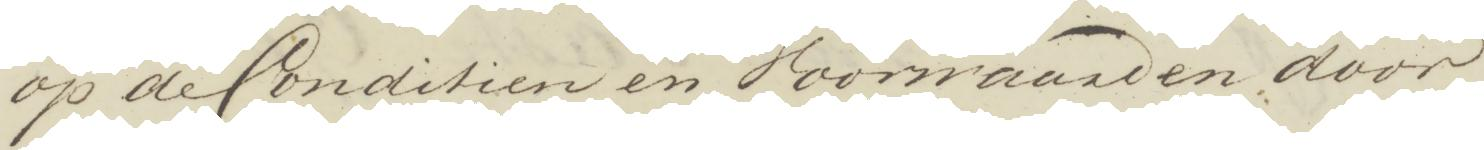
op de Conditien en Voorwaarden door
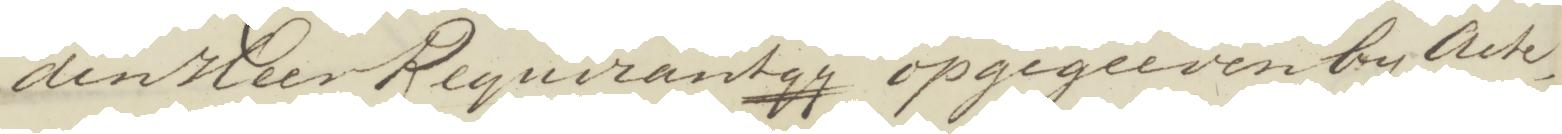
den Heer Requirant qq opgegeeven by Acte
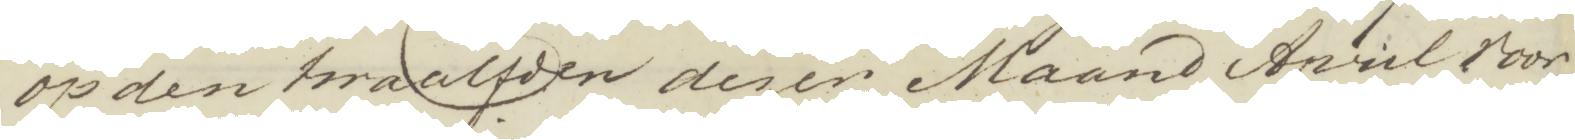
op den twaalfden deser Maand April voor
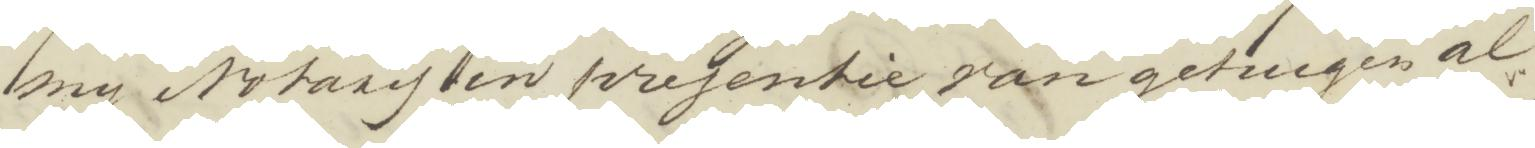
my Notaris in presentie van getuigen al„
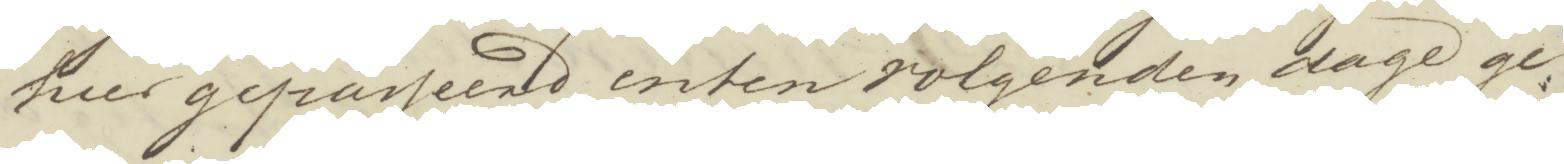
hier gepasseerd, en ten volgenden dage ge„
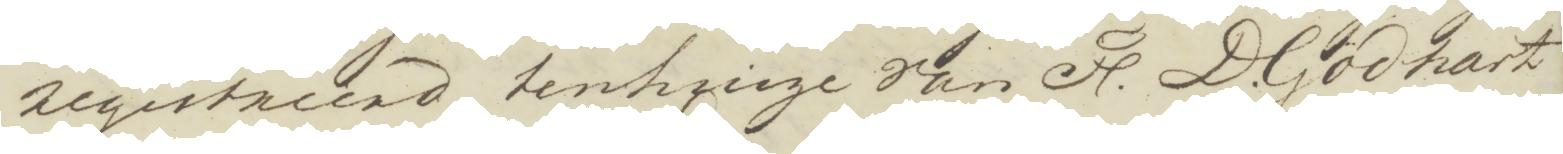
=registreerd ten huize van F. D. Godhart
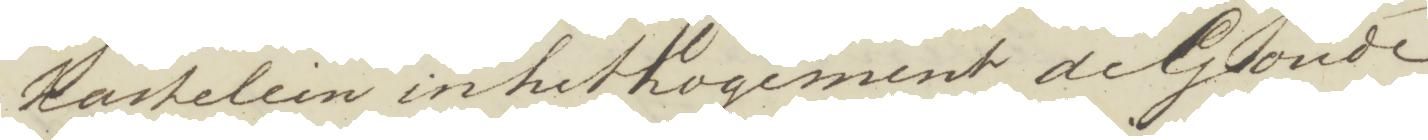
kastelein in het Logement de Goude
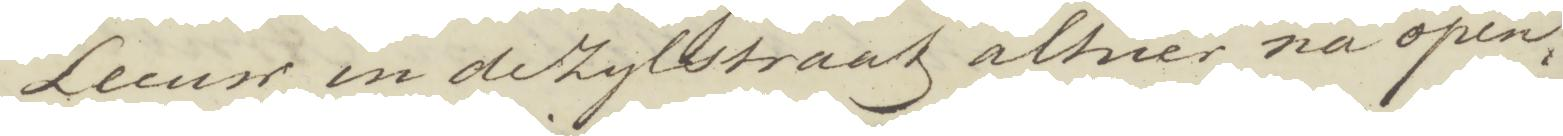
Leeuw in de Zylstraat alhier, na open:
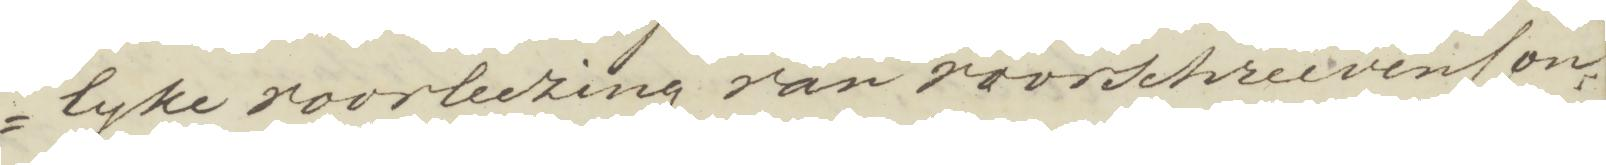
=lyke voorleezing van voorschreeven Con:
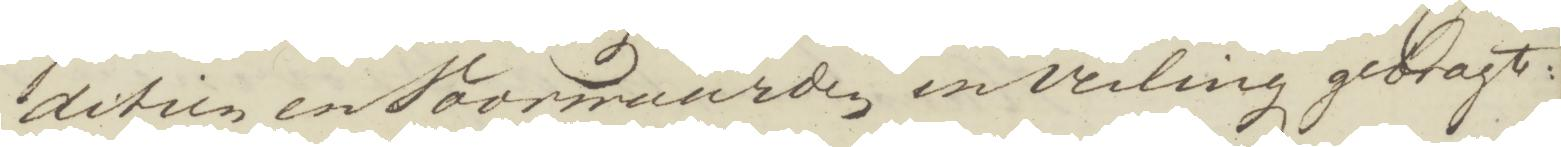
ditien en Voorwaarden in veiling gebragt:
